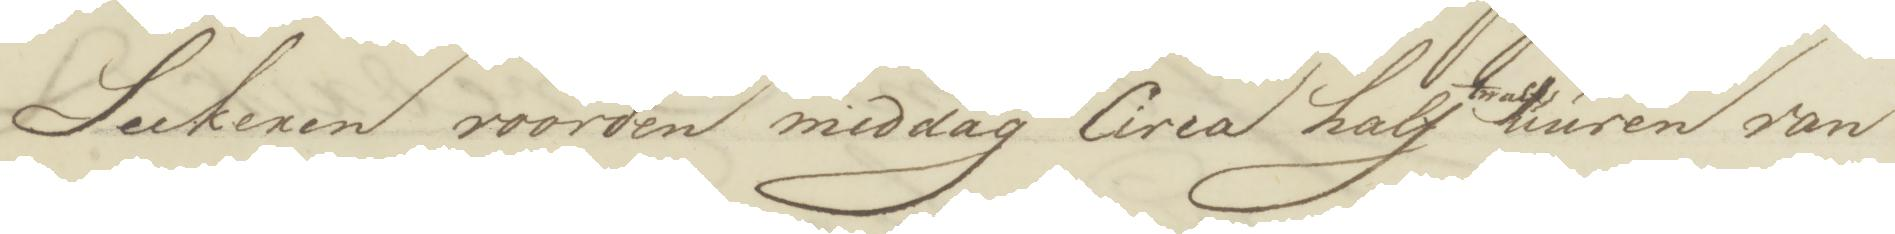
seekeren voorden middag Circa half twalfs uuren van
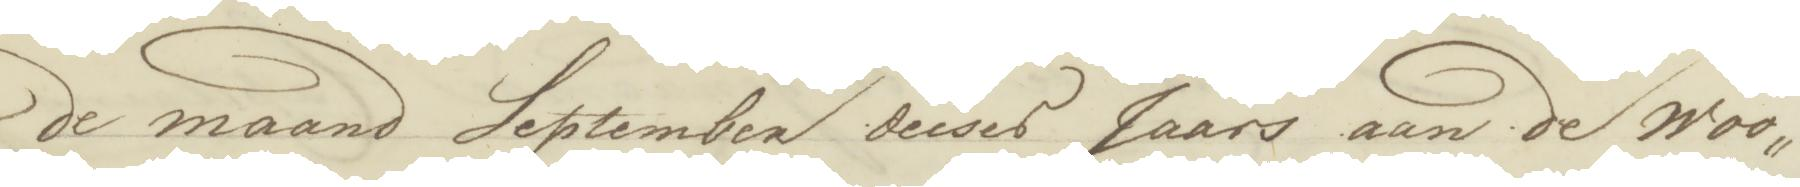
de maand september deeses Jaars aan de woo„
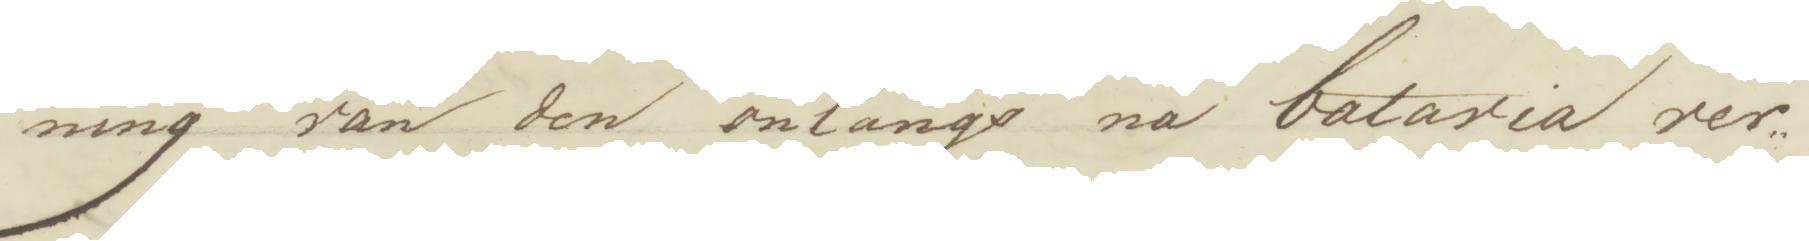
ning van den onlangs na batavia ver„
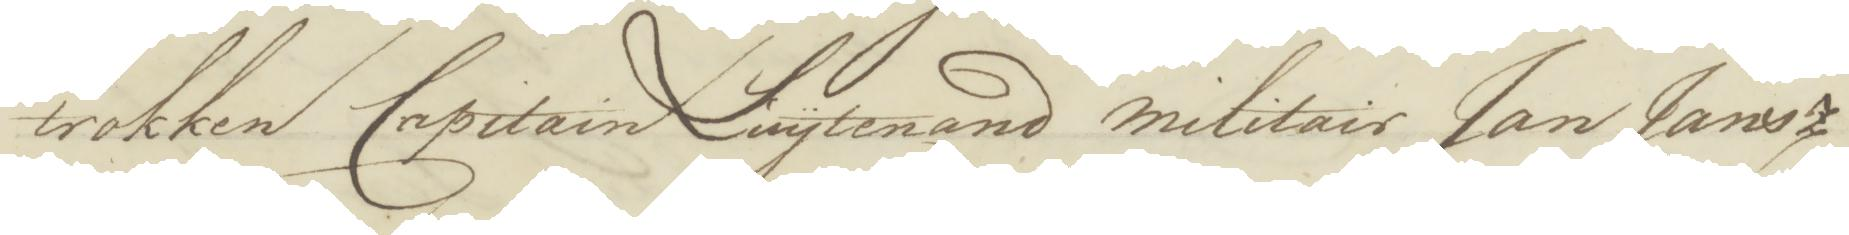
trokken Capitain Luijtenand militair Jan Jansz
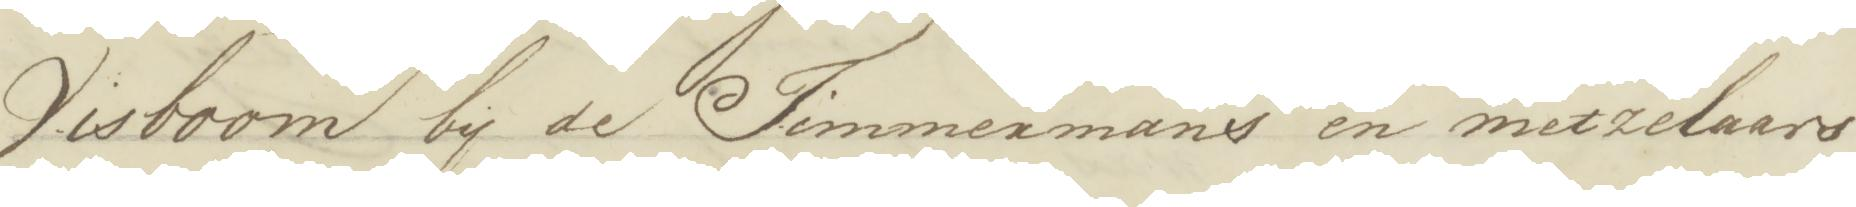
Visboom bij de Timmermans en metzelaars
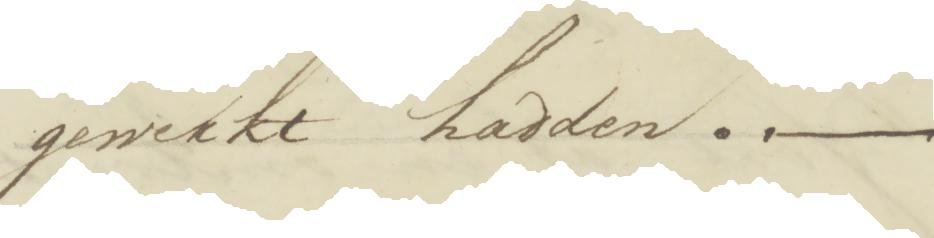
gewerkt hadden.
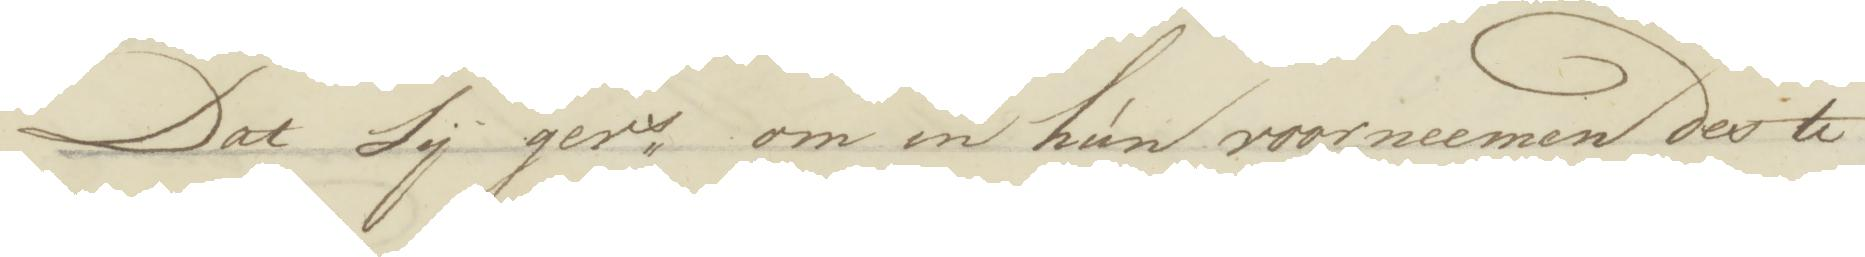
Dat zij gev„s om in hun voorneemen des te
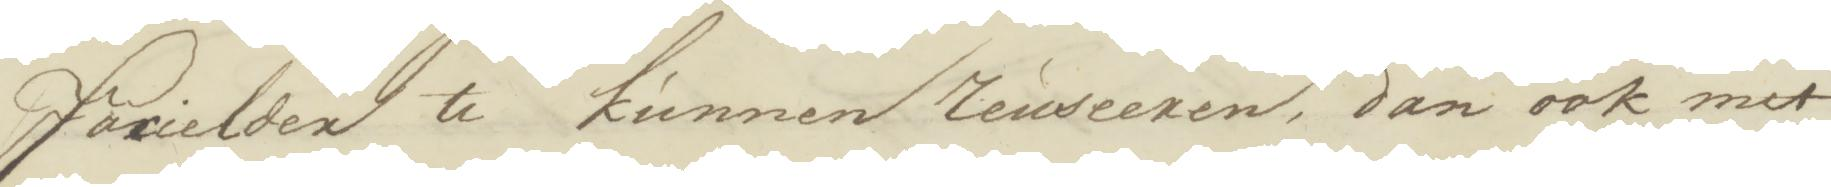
facielder te kunnen reuseeren, dan ook met
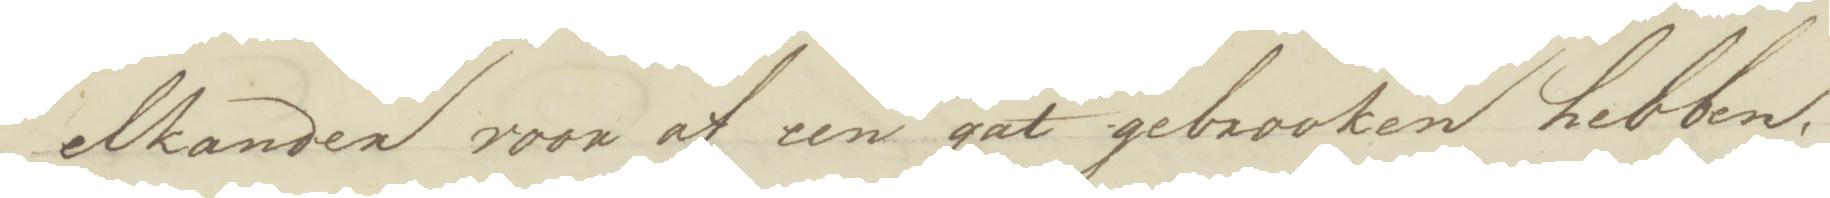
elkander voor af een gat gebrooken hebben,
